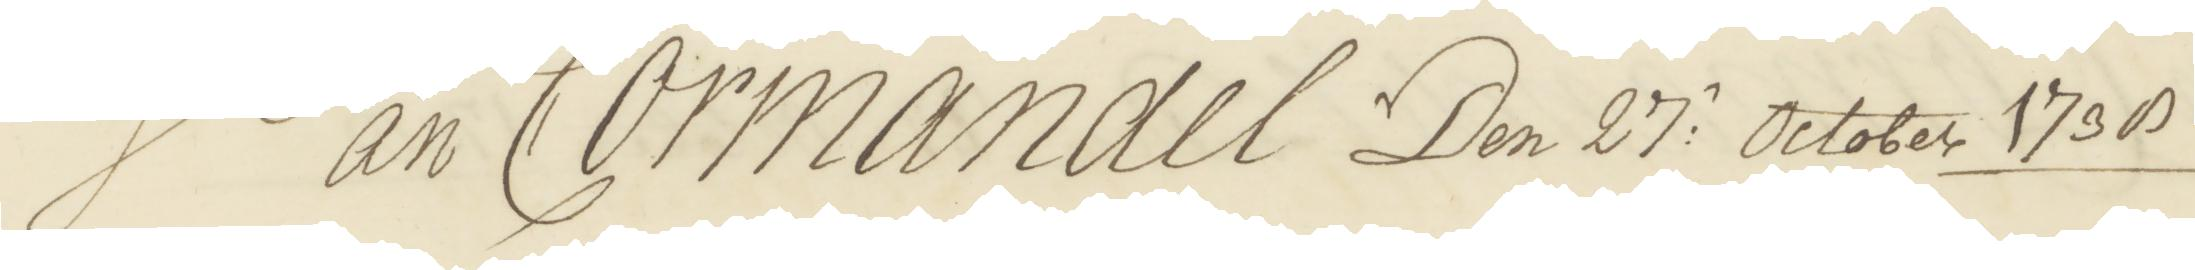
Van Cormandel Den 27:' october 1738
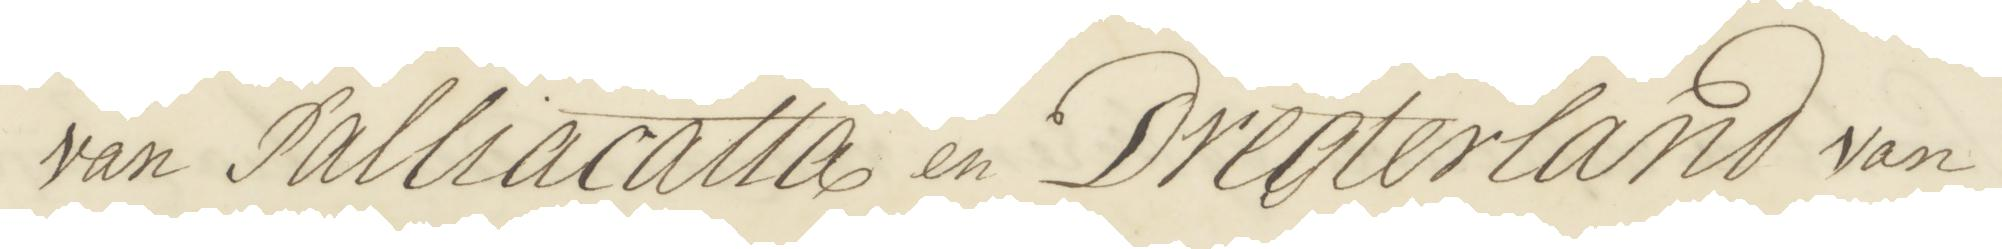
van Palliacatta en Dregterland van
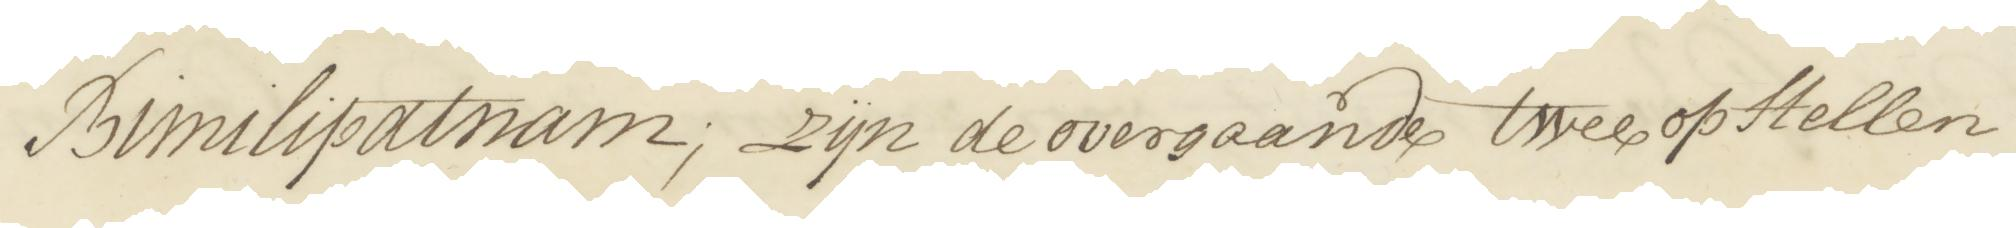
Bimilipatnam; zijn de overgaande twee opstellen
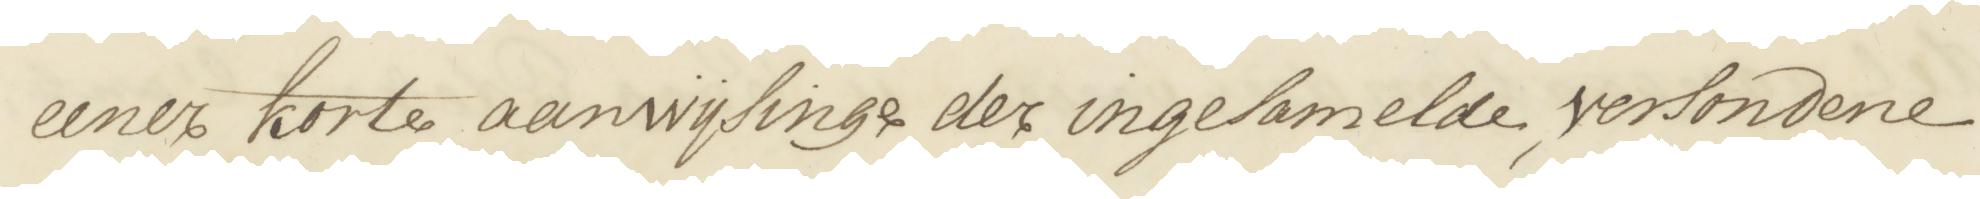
eener korte aanwijsinge der ingesamelde, versondene
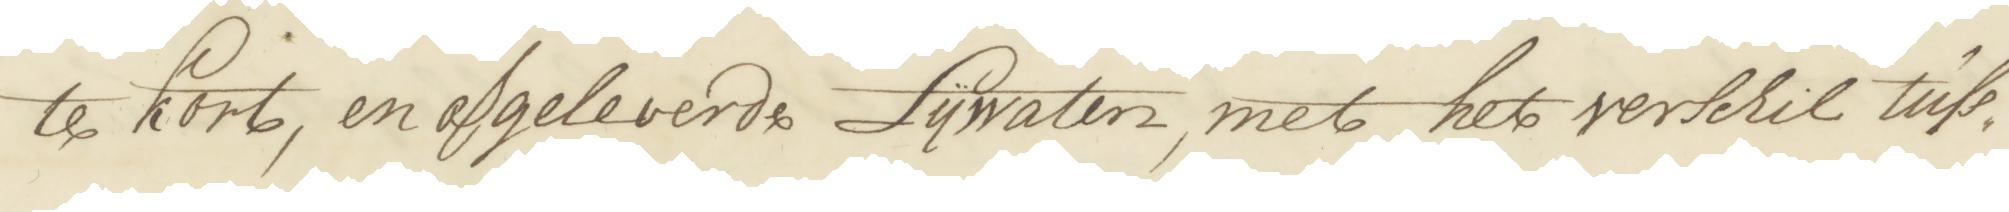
te kort, en overgeleverde lijwaten, met het verschil tuss„
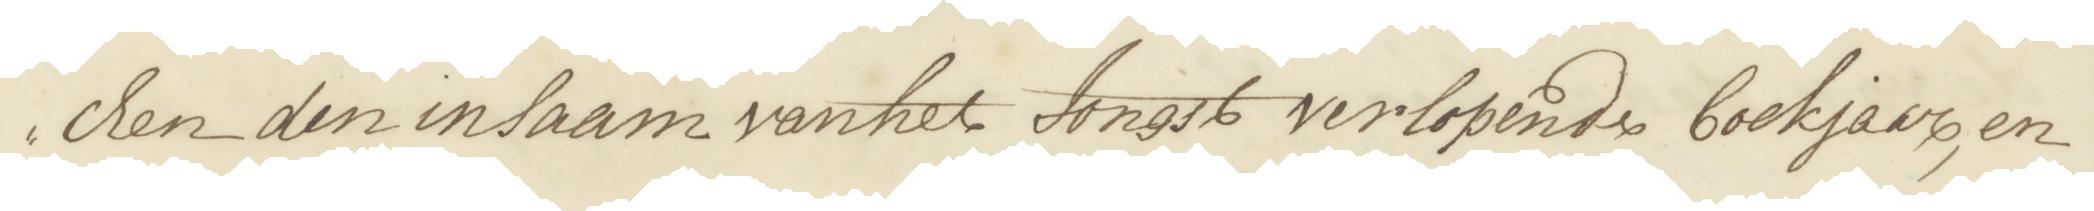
„chen den insaam vanhet Iongst verlopende boekjaar, en
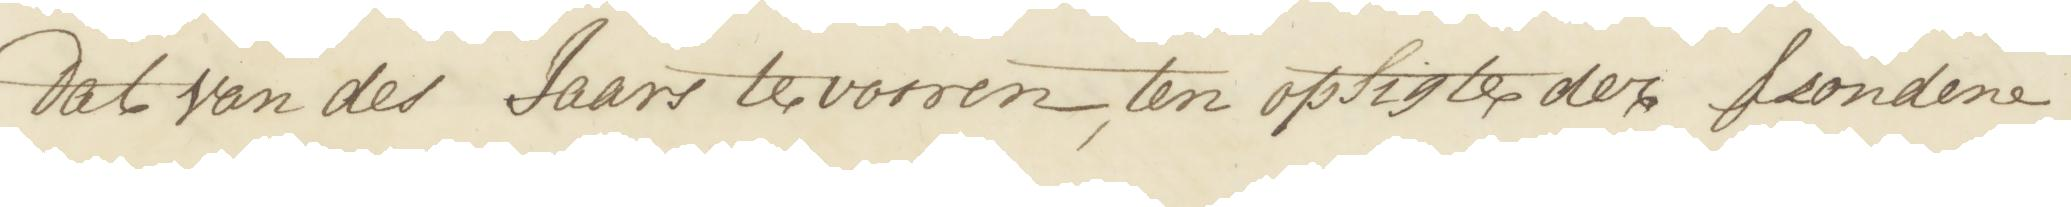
dat van des Iaars te vooren, ten opsigte der verzondene
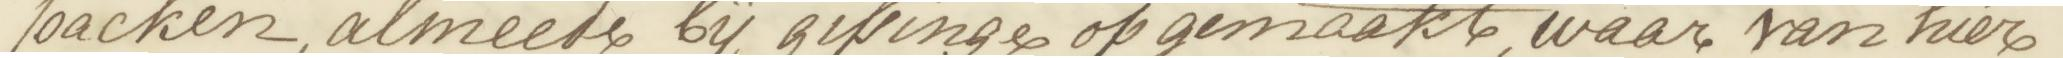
packen, almeede bij gissinge op gemaakt, waar van hier
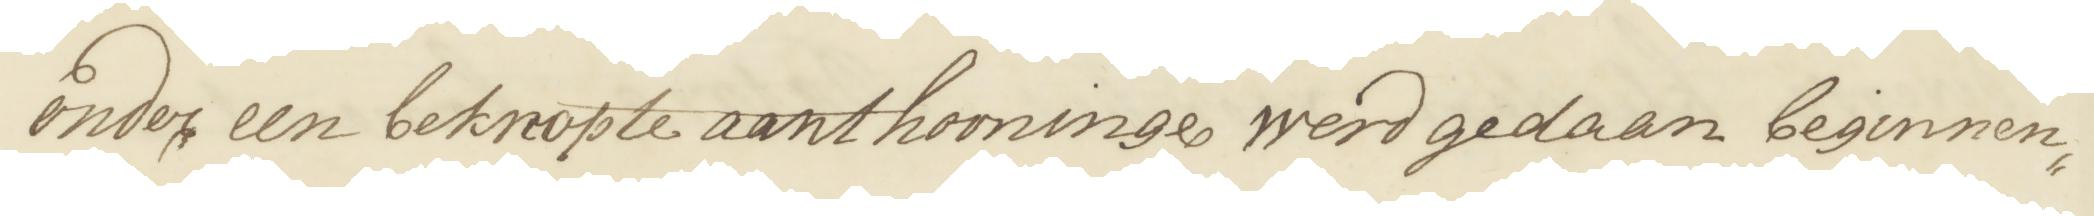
onder een beknopte aanthooninge werd gedaan beginnen„
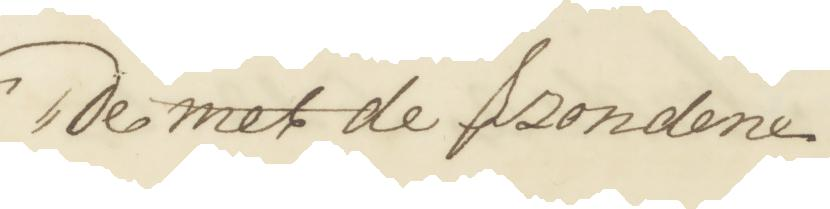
„de met de verzondene
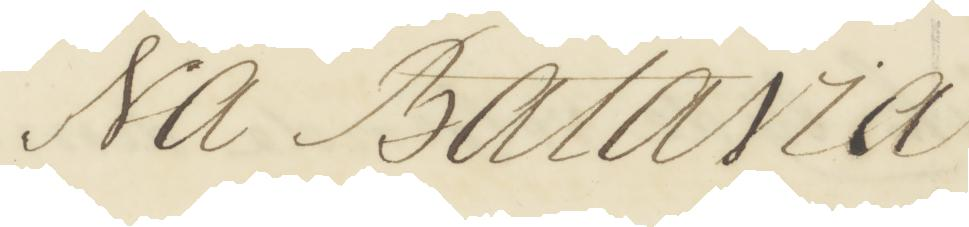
Na Batavia
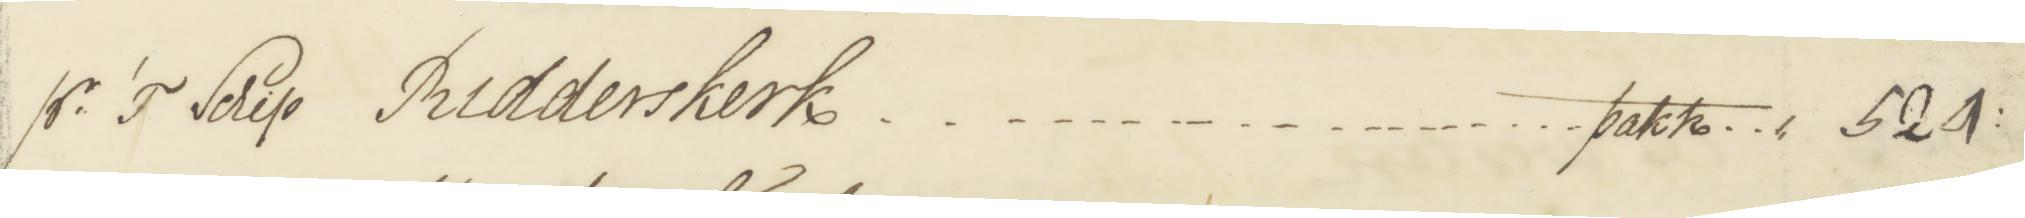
p.r 'T schip Ridderskerk . . - - - - -- - - - - - - - - . . ..pakk. . „ 524:
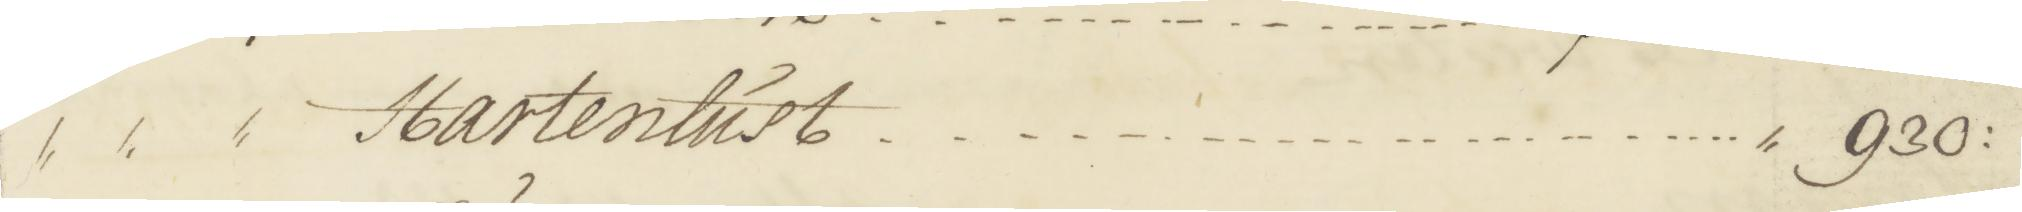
„ „ „ Hartenlust - - - - - . - - - - - - - - - - - - - - ... „ 930:
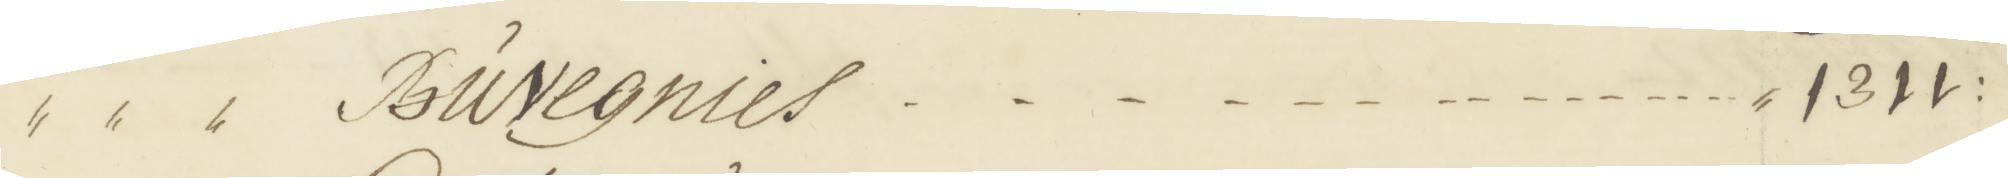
„ „ „ Buvegnies - - - - - - -- - - - - - - . „ 1311:
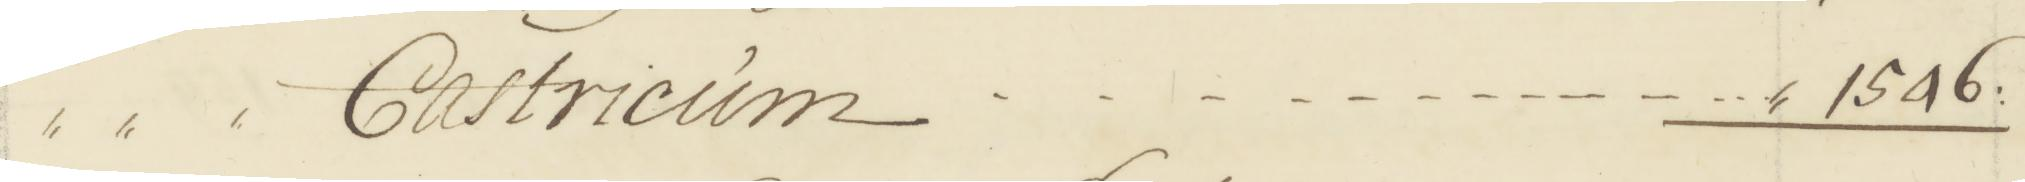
„ „ „ Castricum - - - - - - - - - - - ...„ 1546:
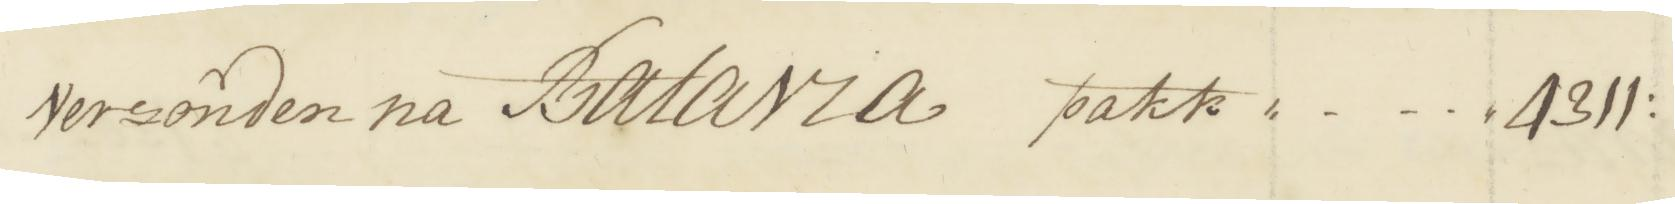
Verzonden na Batavia pakk „ - - . 4311:
